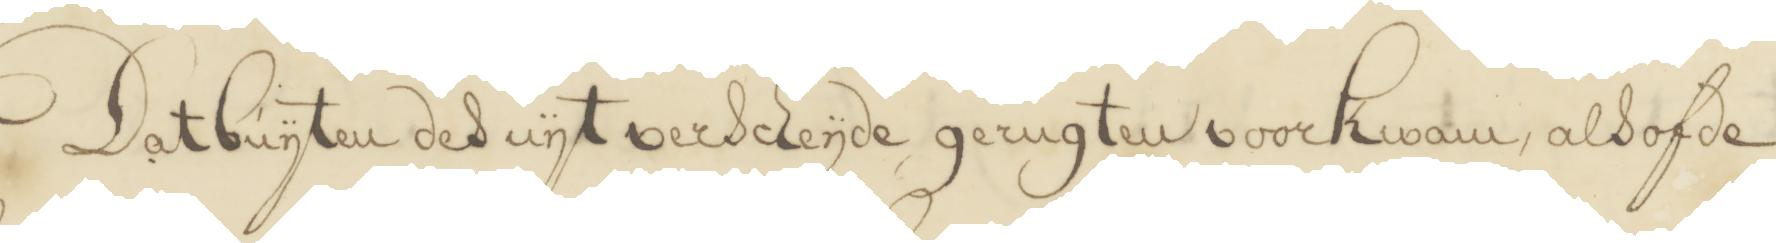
Dat buijten des uijt verscheijde gerugten voorkwam, als of de
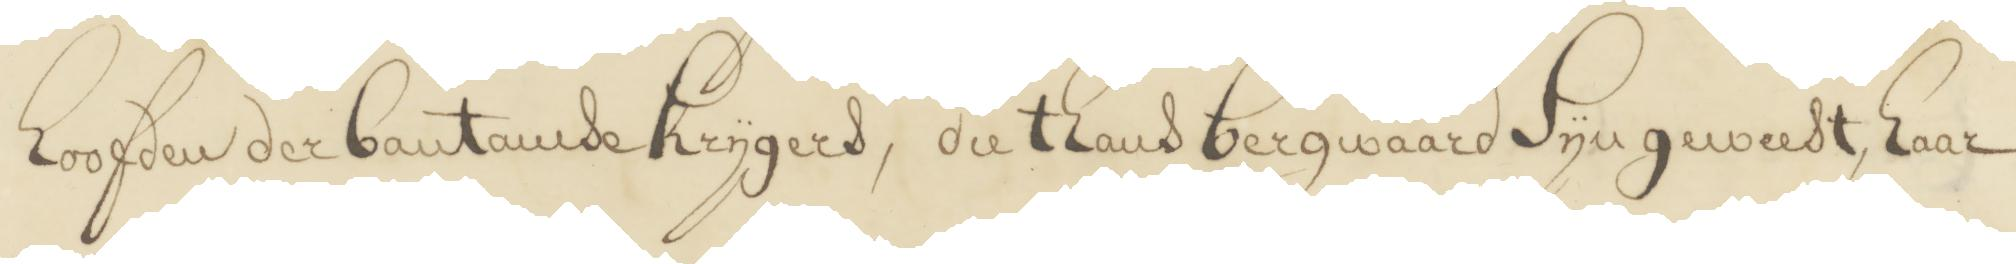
hoofden der bantamse krijgers, die thans bergwaard Sijn geweest, haar
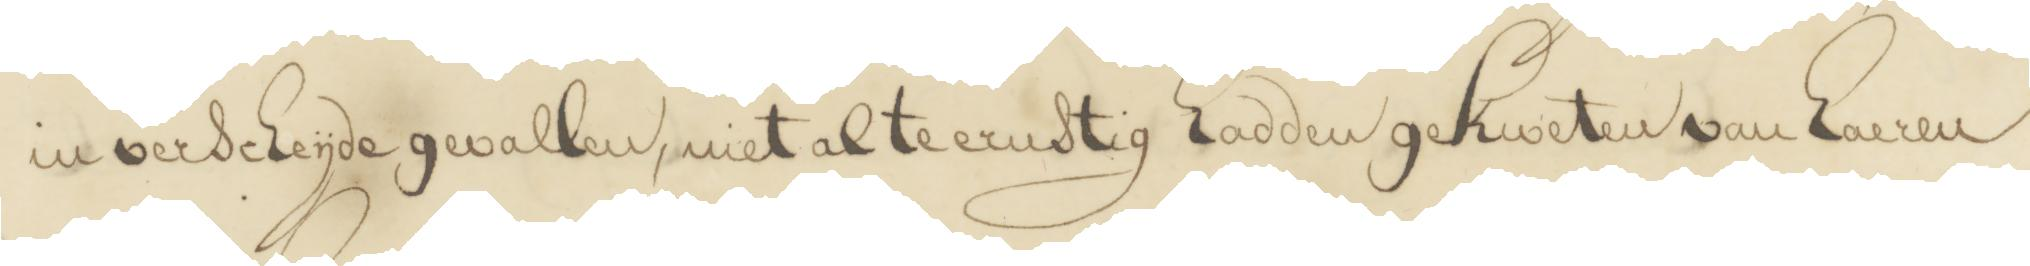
in verscheijde gevallen, niet al te ernstig hadden gekweten van haeren
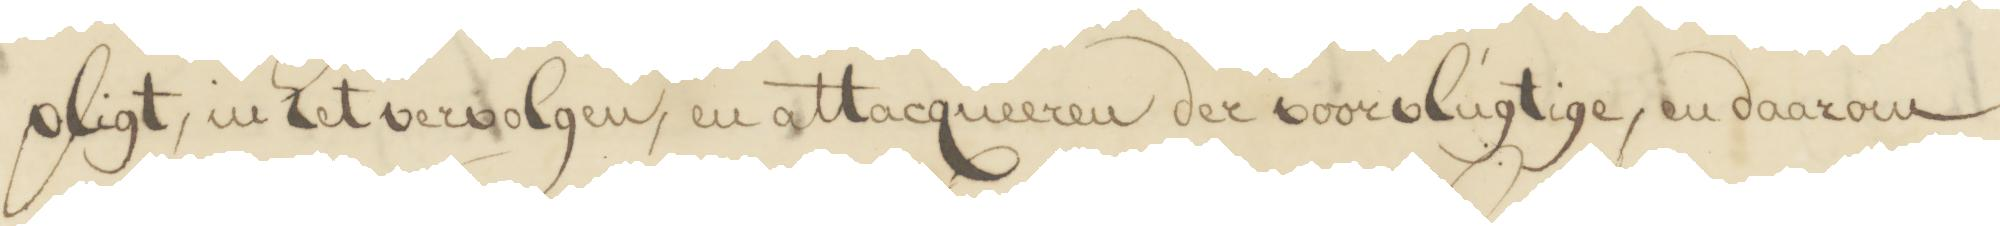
pligt, in het vervolgen, en attacqueeren der voorvlugtige, en daarom
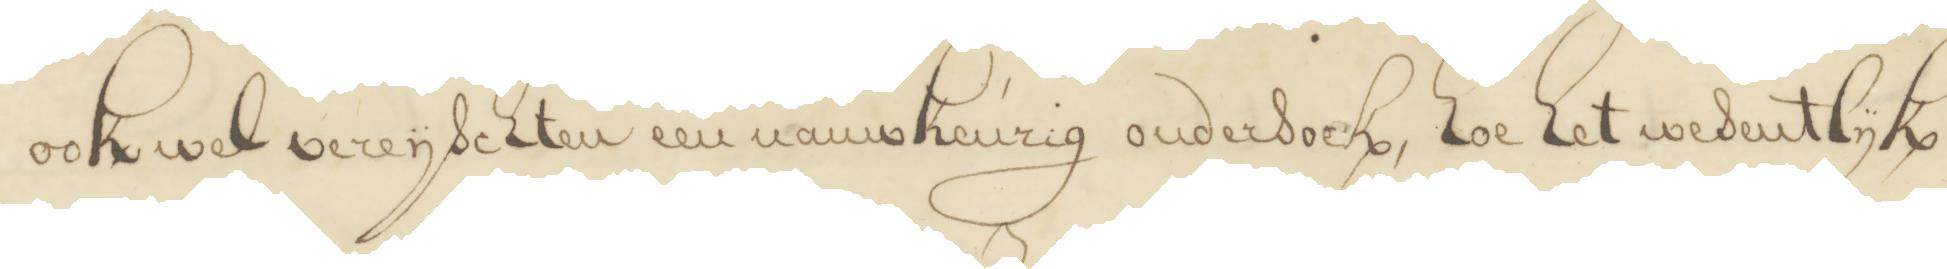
ook wel vereijschten een nauwkeurig ondersoek, hoe het wesentlijk
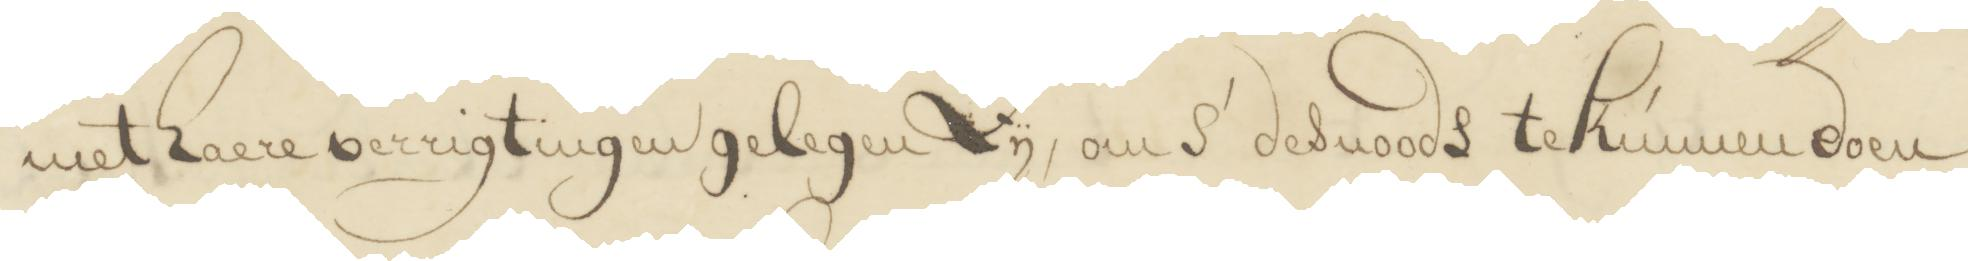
met haere verrigtingen gelegen Zij, om s' desnoods te kunnen doen
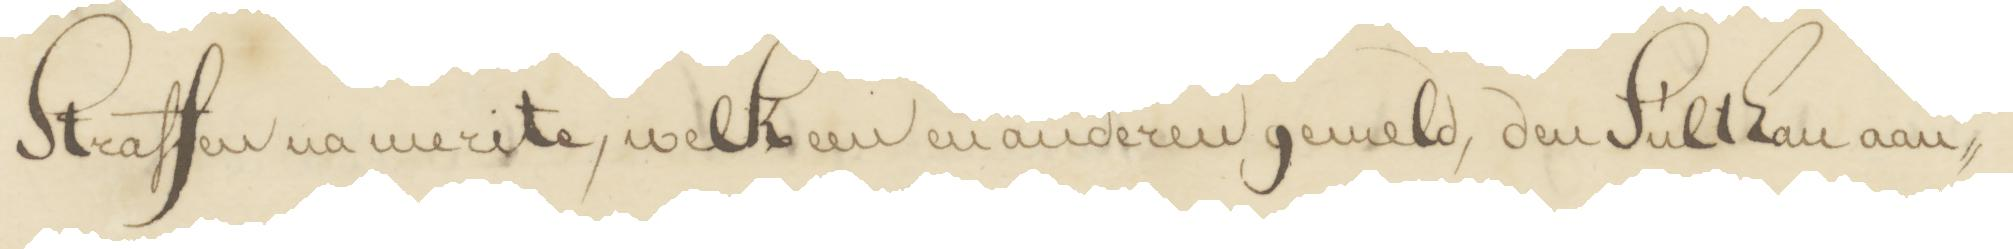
straffen na merite, welk een en anderen gemeld, den Sulthan aan„
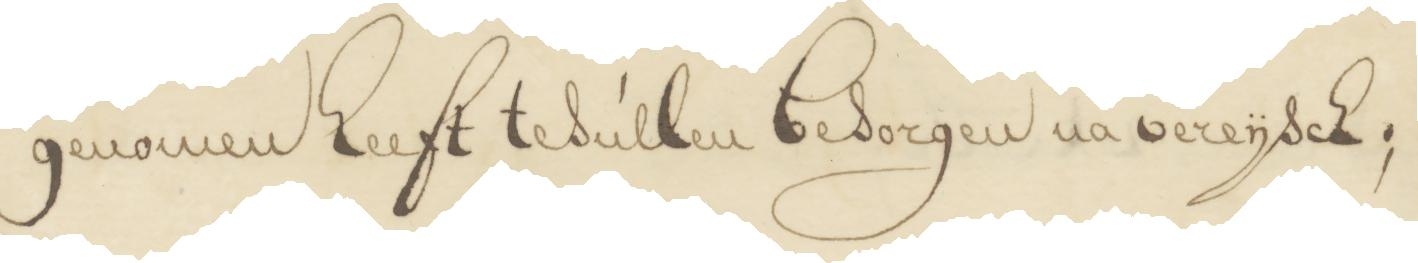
genomen heeft te sullen besorgen na vereijsch;
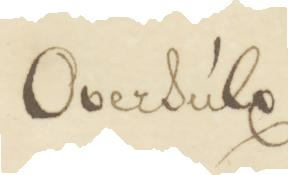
Oversulx
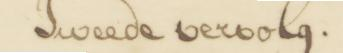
Tweede vervolg.
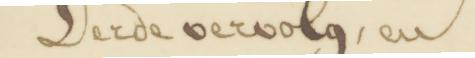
Derde vervolg, en
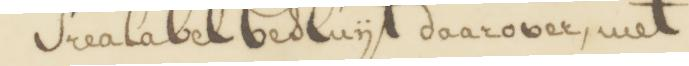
Prealabel besluijt daarover, met
